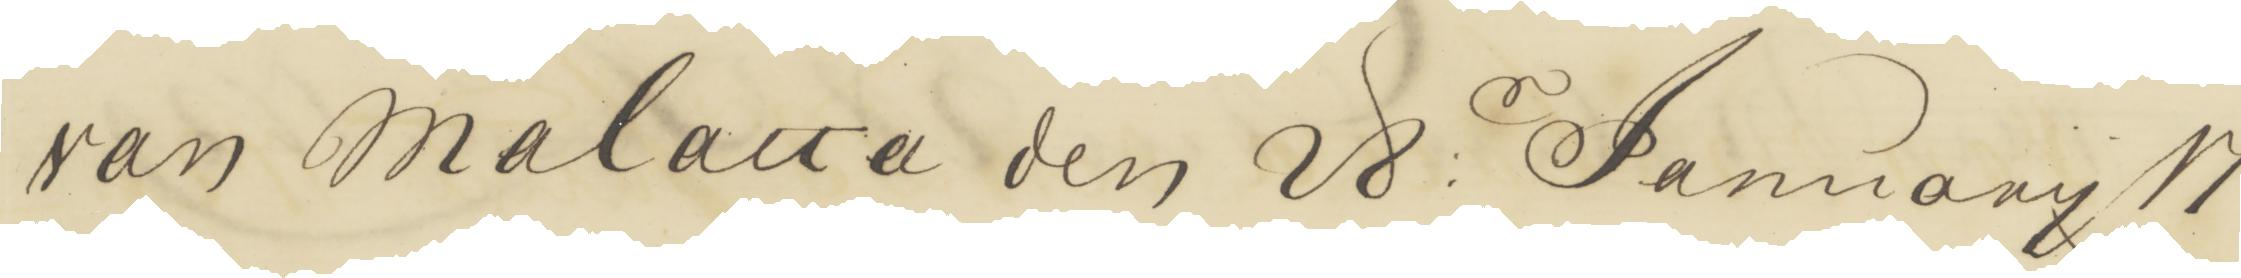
van Malacca den 28:' Januarij 1729
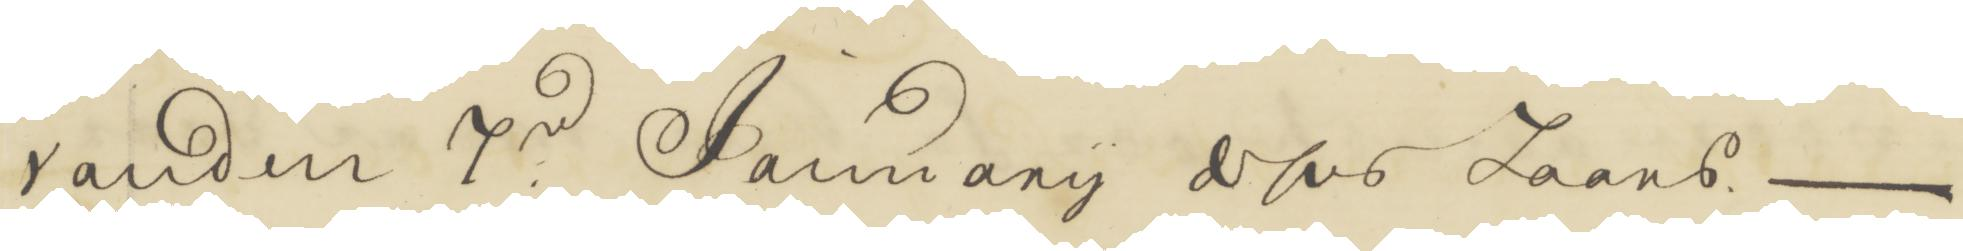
van den 7:e Januarij deses Jaars.
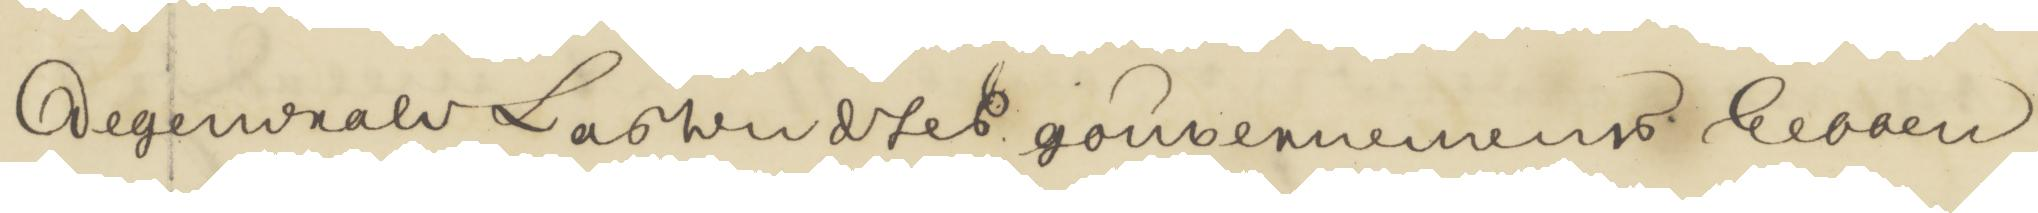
de generale lasten deses gouvernements hebben
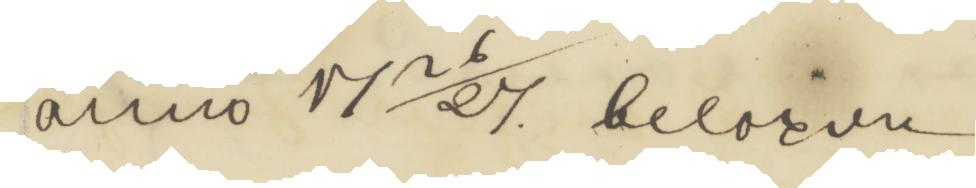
anno 177 26/27 belopen . . . . . . ƒ143818. – –
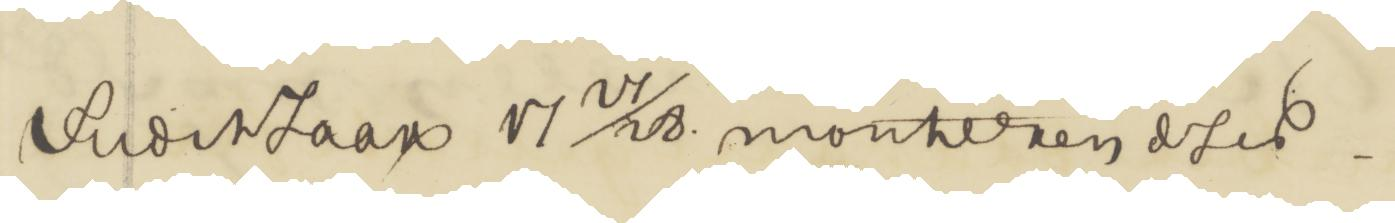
En dit Jaar 17 27/28. monteeren deses . . . . . . . „ 150123. 15. 8.
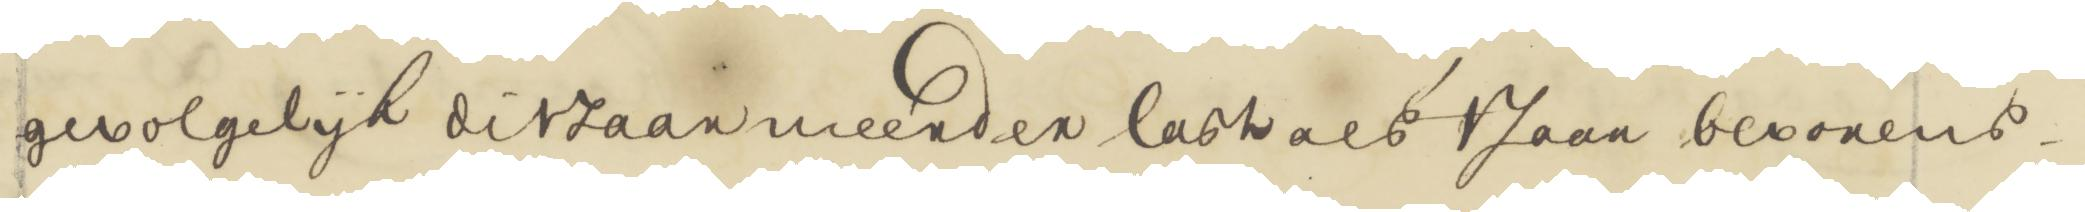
gevolgelijk dit Jaar meerder last als tJaar bevorens . . . . ƒ. 6305. 15. 8.
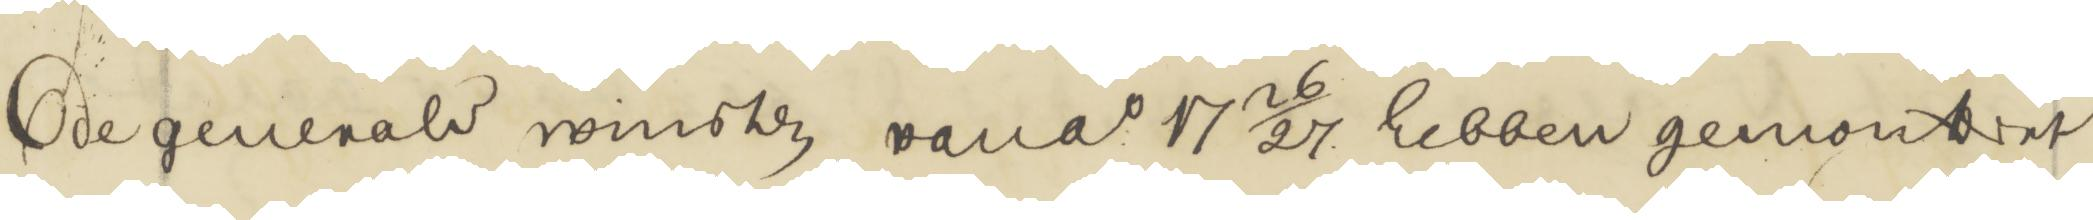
de generale winsten van a:o 17 26/27. hebben gemonteert
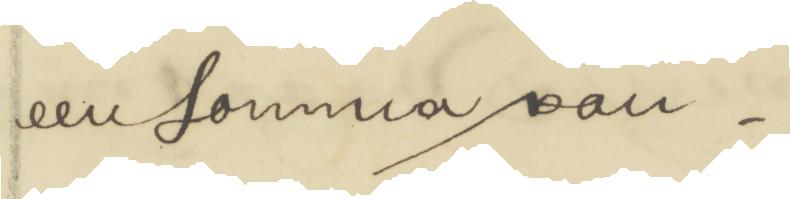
een somma van - - - - - - - - ƒ132888. 14. 8.
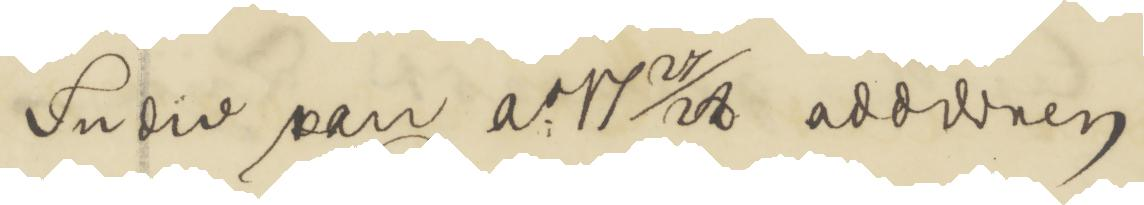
Jndie van a:o 17 27/28 addeeren . . . . . . . . „ 77883. 13. 8.
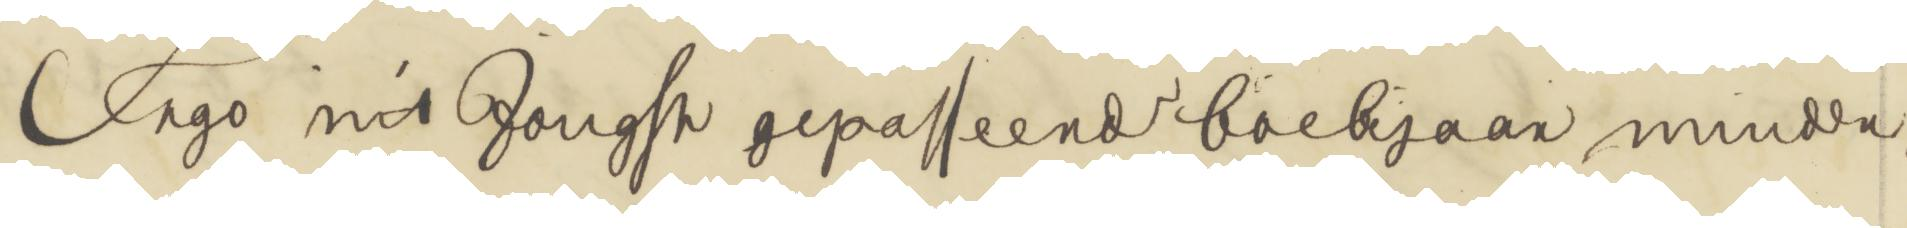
Ergo in't Jongst gepasseerde boekjaar minder winst
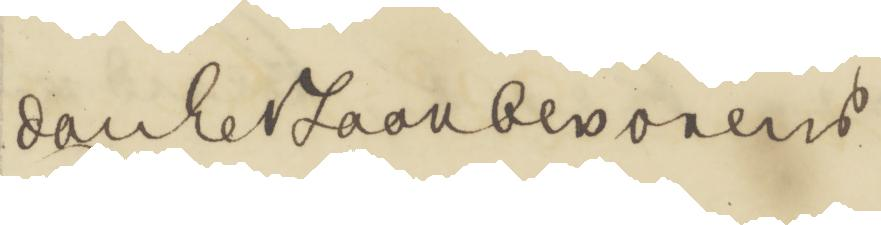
dan het Jaar bevorens . . . . . . . . . . . „ 55005. 1. –.
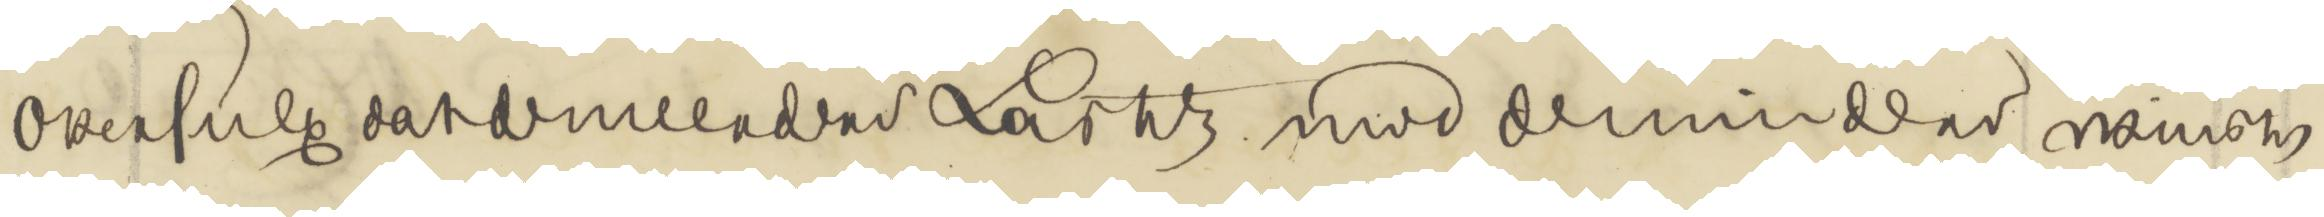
oversulx dat de meerdere lasten med de mindere winsten
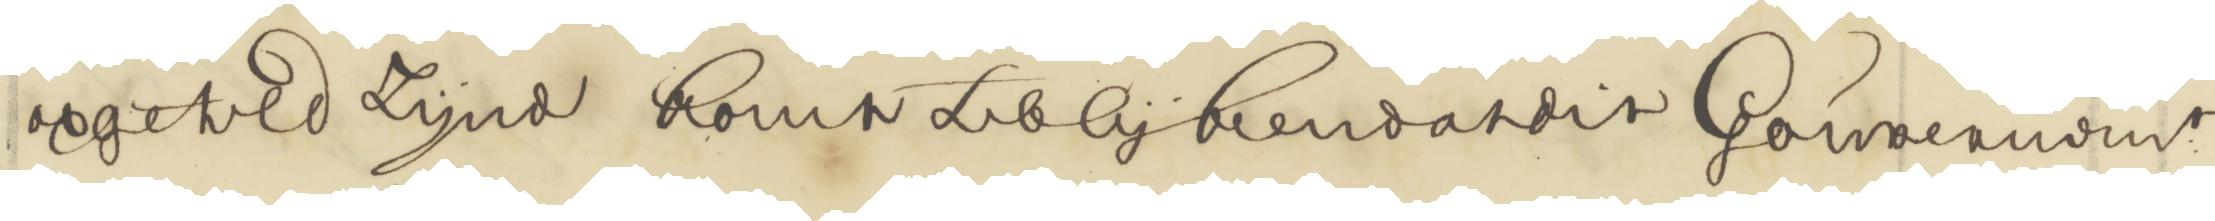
opgeteld zijnde komt te blijken dat dit Gouvernem:t
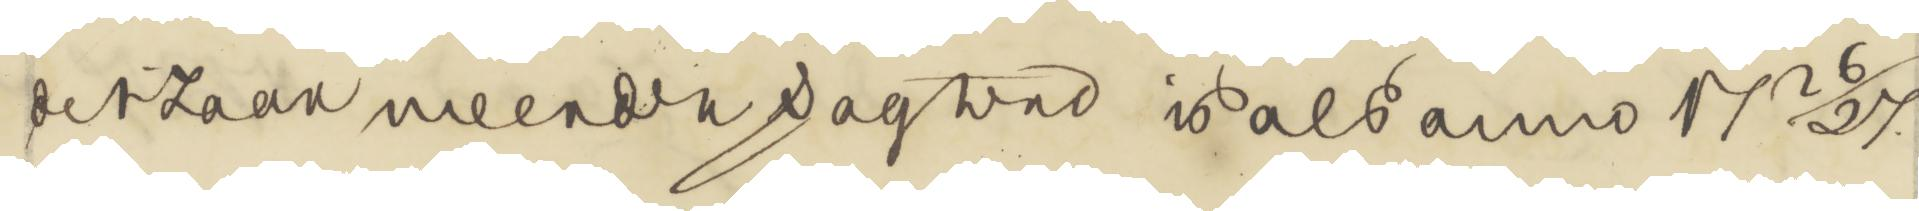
dit Jaar meerder veragterd is als anno 17 26/27. . . . . ƒ 61310. 16: 8.
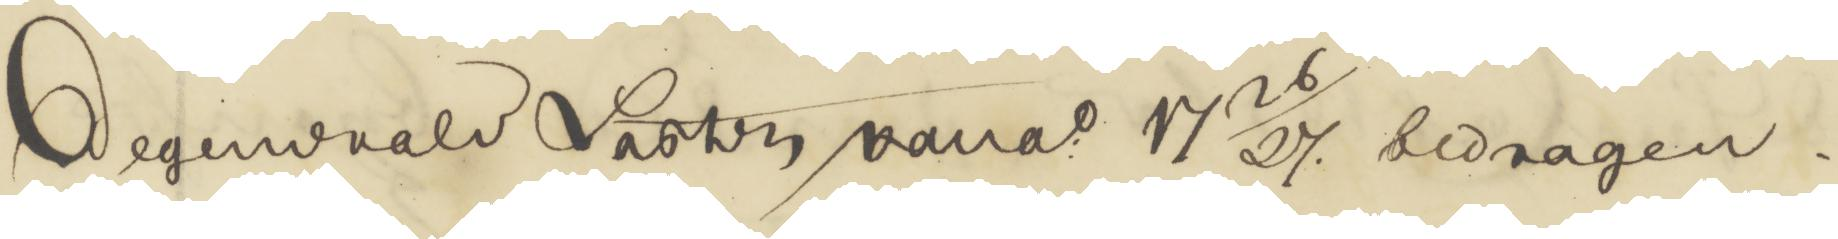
de generale lasten van a:o 17 26/27. bedragen - - - ƒ143818 . – –
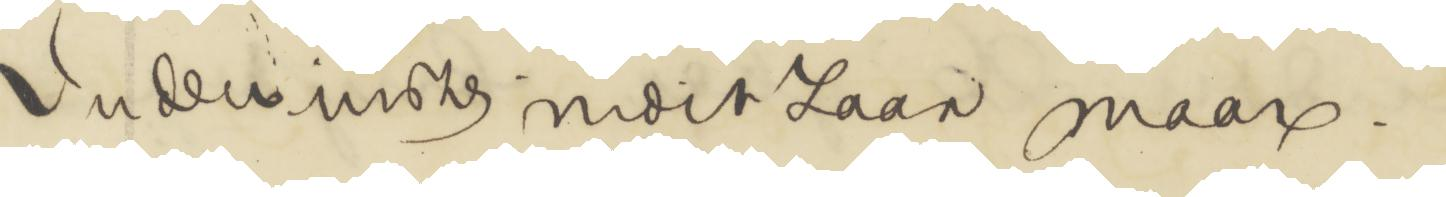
En de winsten in dit Jaar maar . . . . . . „ 132888. 14. 8.
